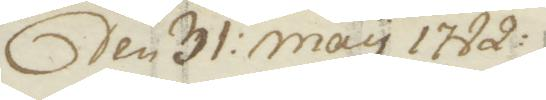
den 31: maij 1782:
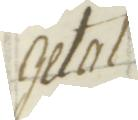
getal
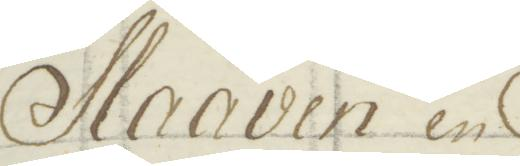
Slaaven en
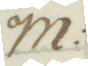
M:
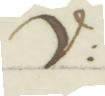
V:
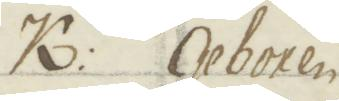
K: Geboren
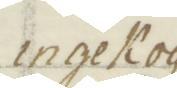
ingekog
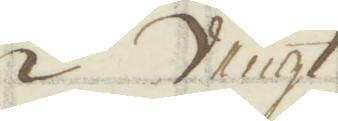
Slavinnen Vrugt
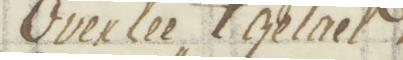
Overlee„ t getael
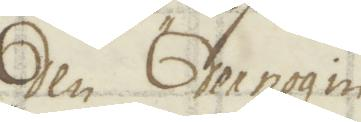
den der nog in
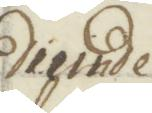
die inde
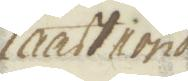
laastrond
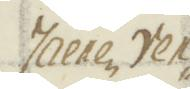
Jaeren ver
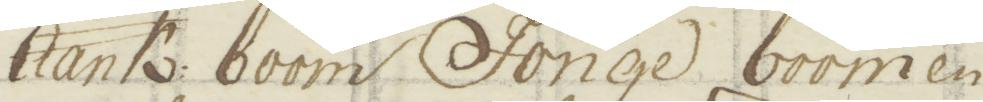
Aank: boom Jonge boomen
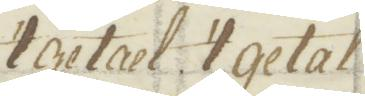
't getael 't getal
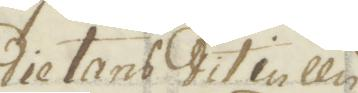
die tans dit in een
